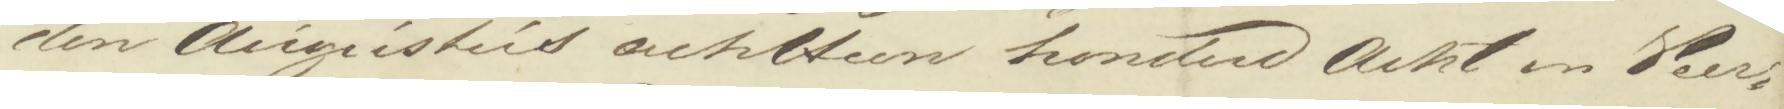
den Augustus achttien honderd Acht in Veer„
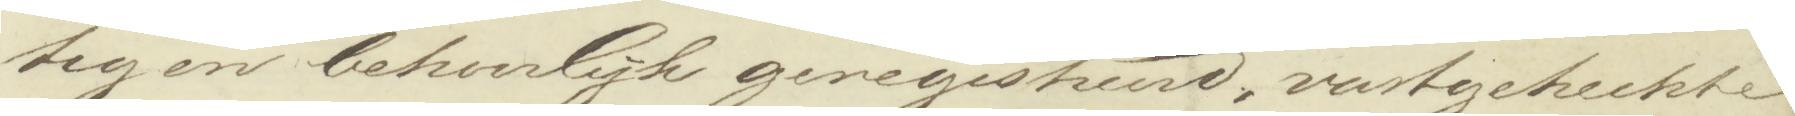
tig en behoorlijk geregistreerd, vastgehechte
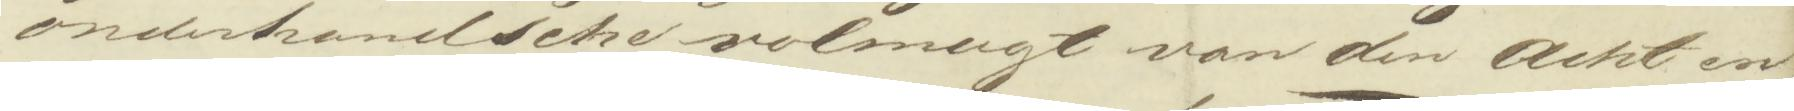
onderhandsche volmagt van den acht en
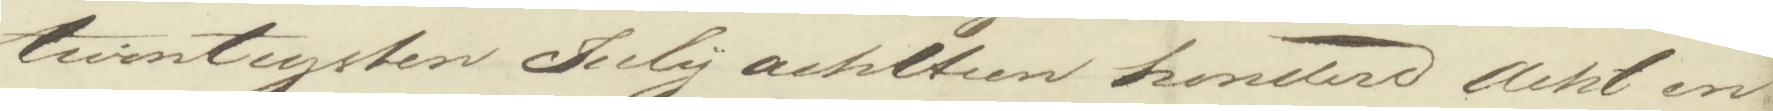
twintigsten Julij achttien honderd acht en
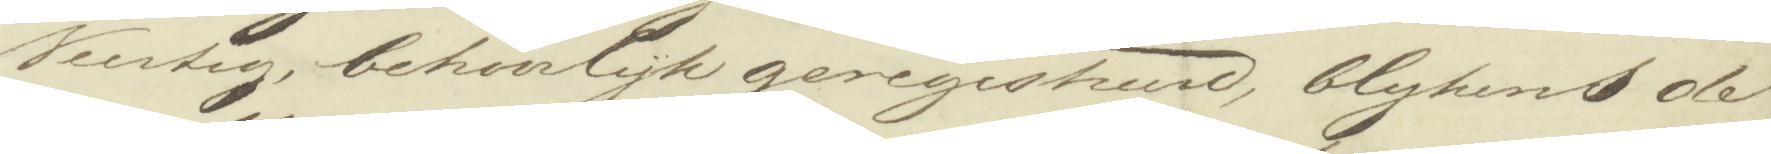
Veertig, behoorlijk geregistreerd, blykens de
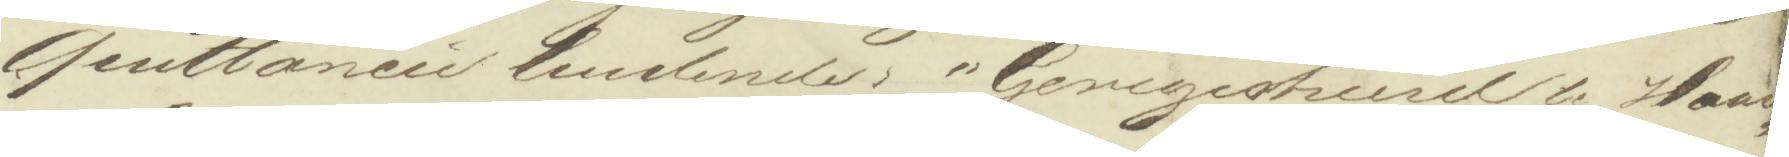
Quittancie luidende: "Geregistreerd te Haar
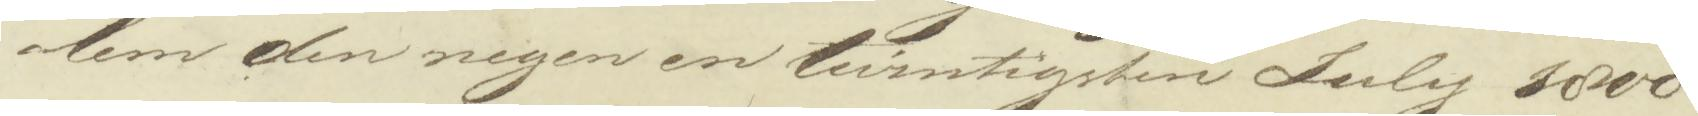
lem den negen en twintigsten Iluy 1800
